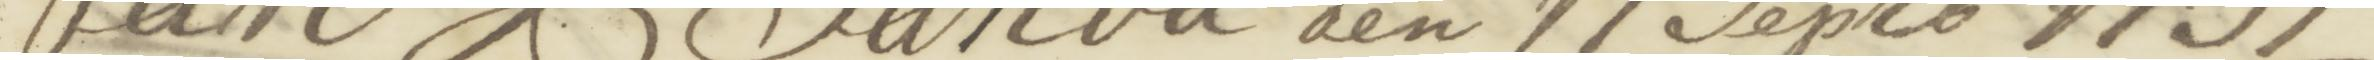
Van Banda den 17 Septb 1737
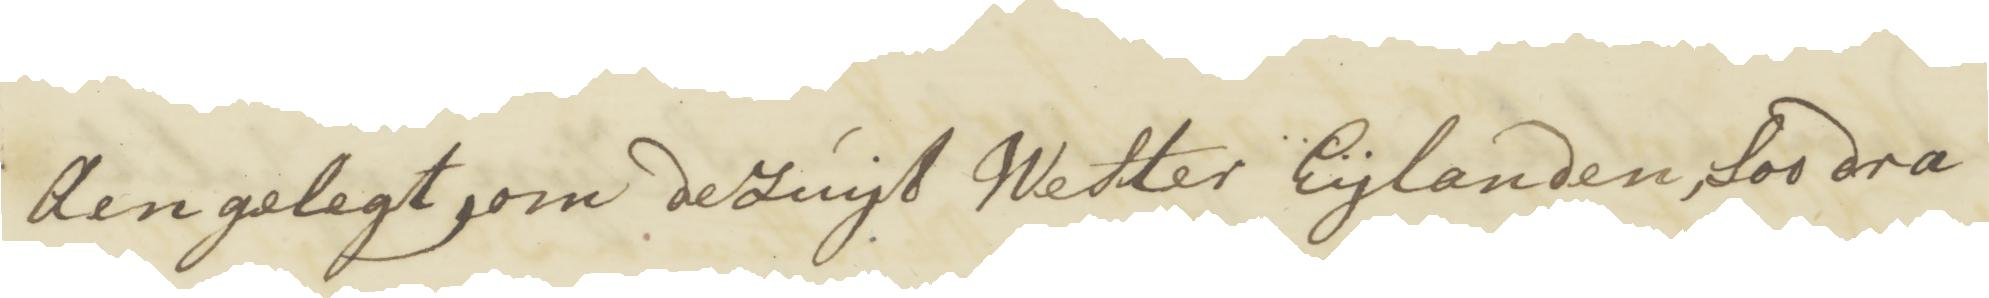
Aen gelegt, om de zuijt Wester Eijlanden, soo dra
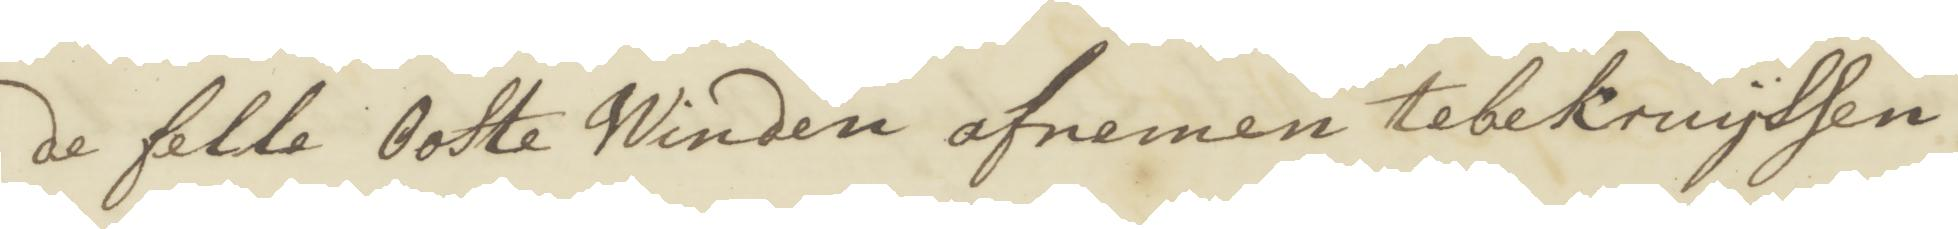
de felle Ooste Winden afnemen tebekruijssen
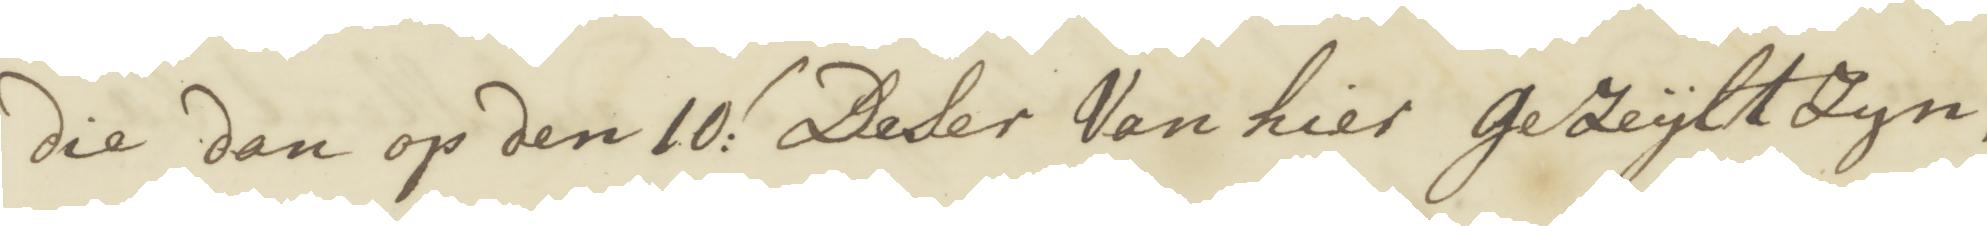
die dan op den 10:' Deser Van hier gezeijlt zyn
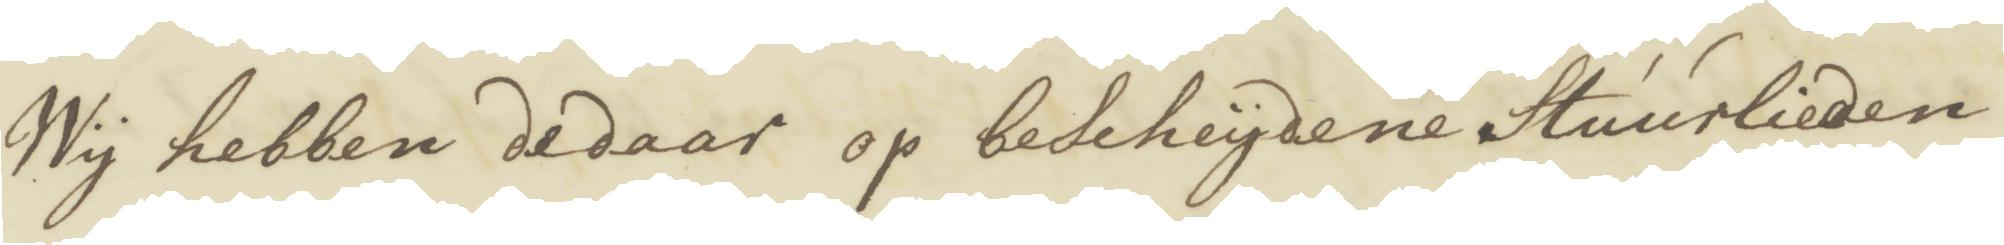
Wij hebben dedaar op bescheijdene stuurlieden
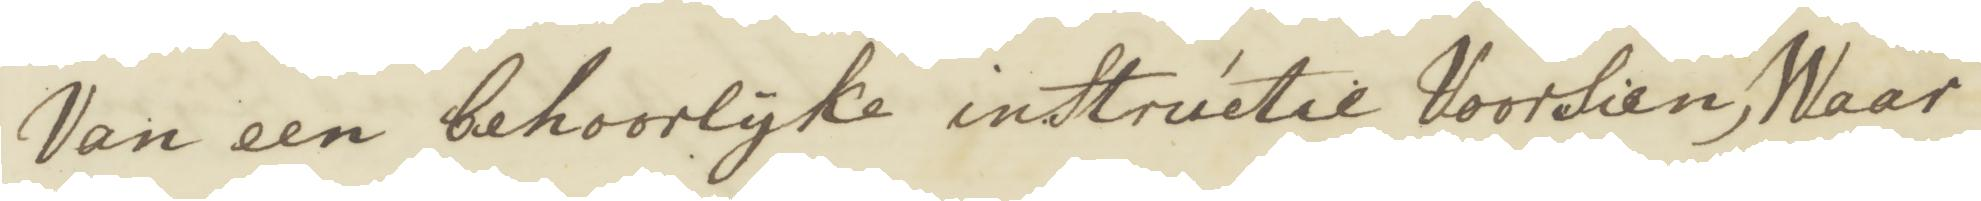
Van een behoorlijke instructie Voorsien, Waar
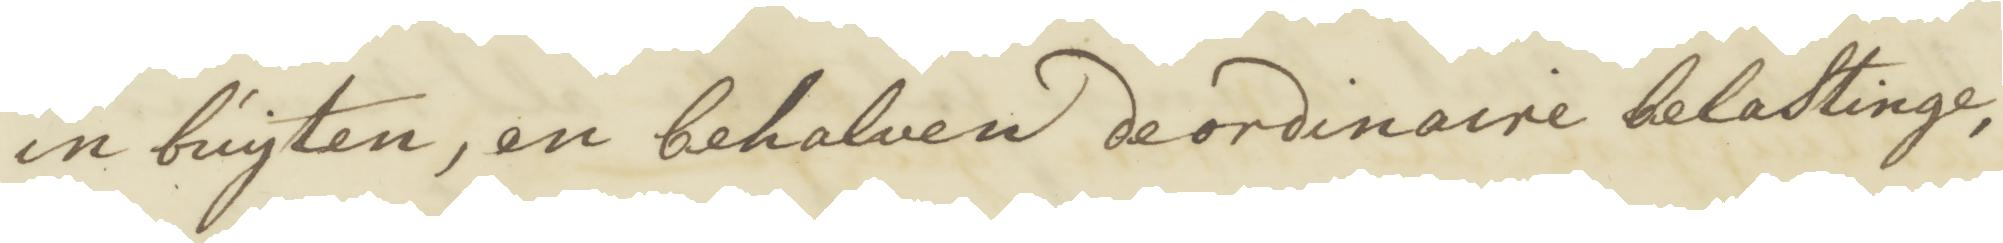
in buijten, en behalven de ordinaire belastinge,
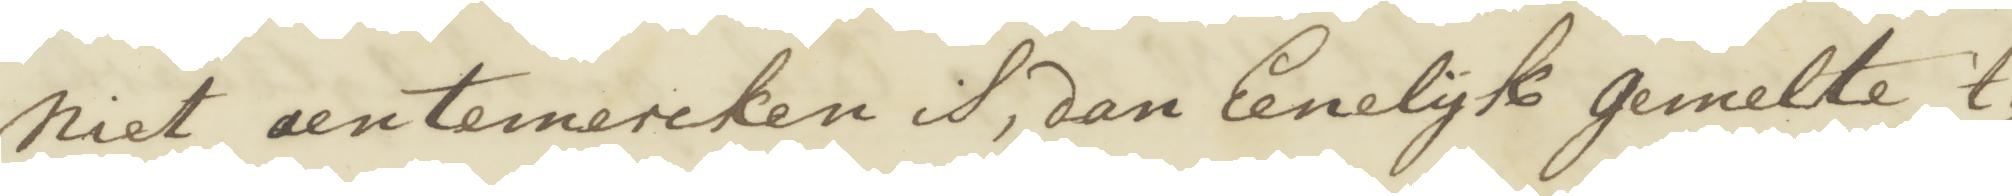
niet aen temercken is, dan Eenelijk gemelte
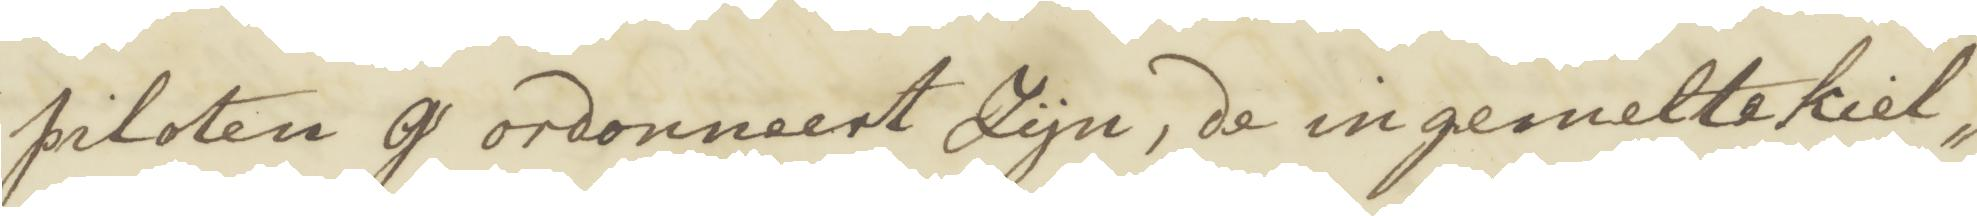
piloten g’ordonneert zijn, de in gemelte kiel„
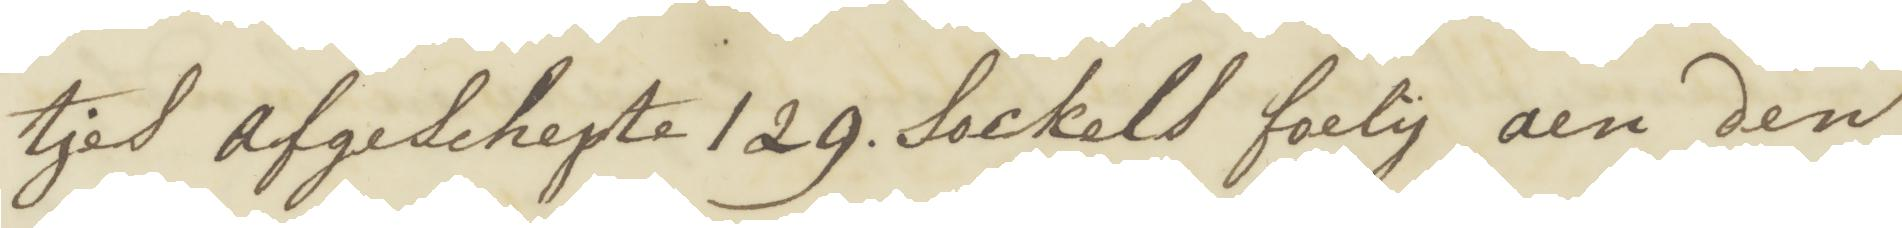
tjes afgeschepte 129. sockels foelij aen den
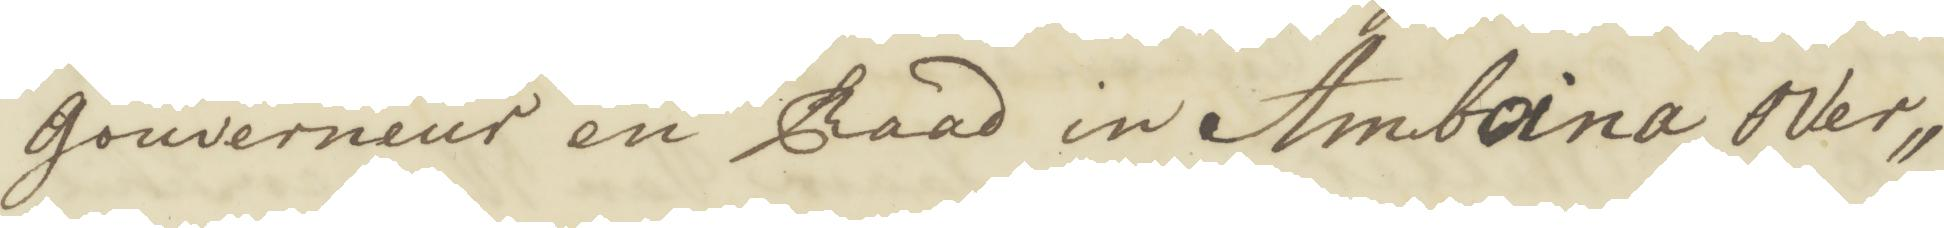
Gouverneur en Raad in Amboina over„
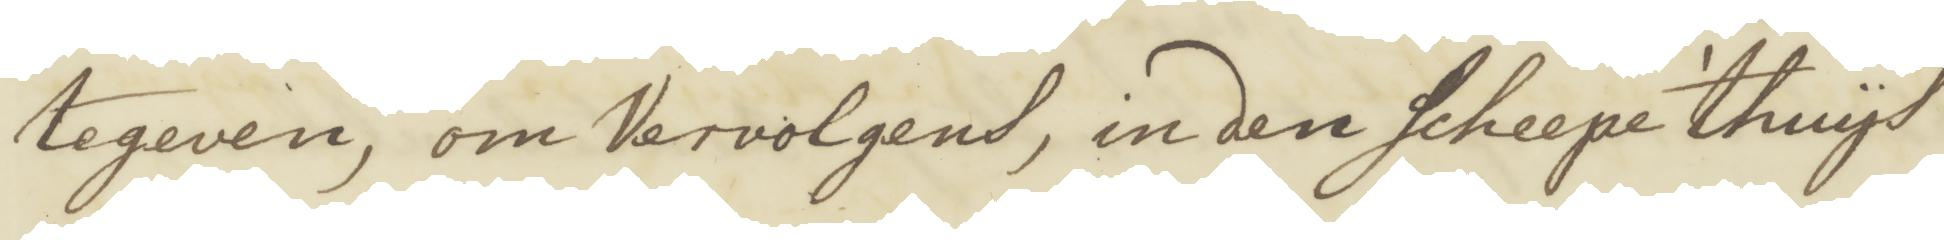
tegeven, om Vervolgens, in den scheepe 'thuijs
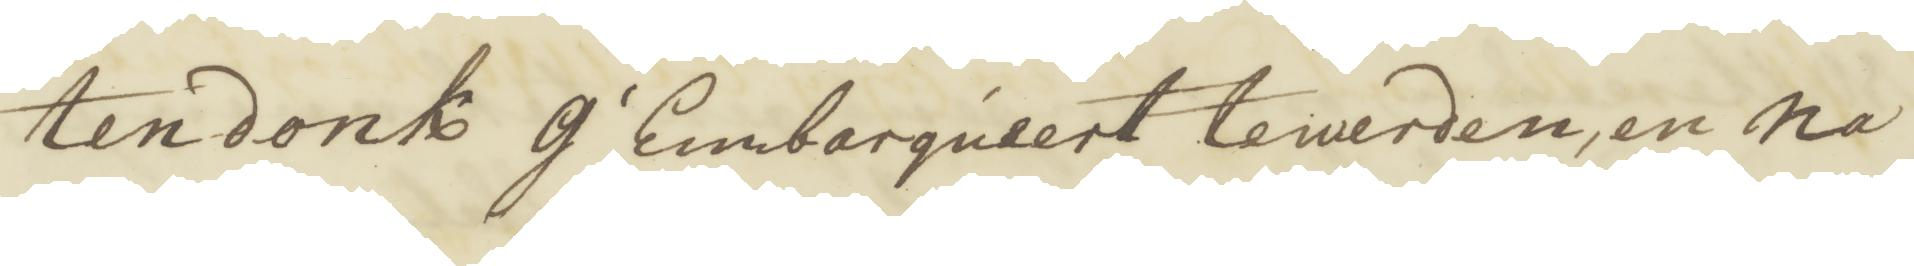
ten donk G’Embarqueert tewerden, en na
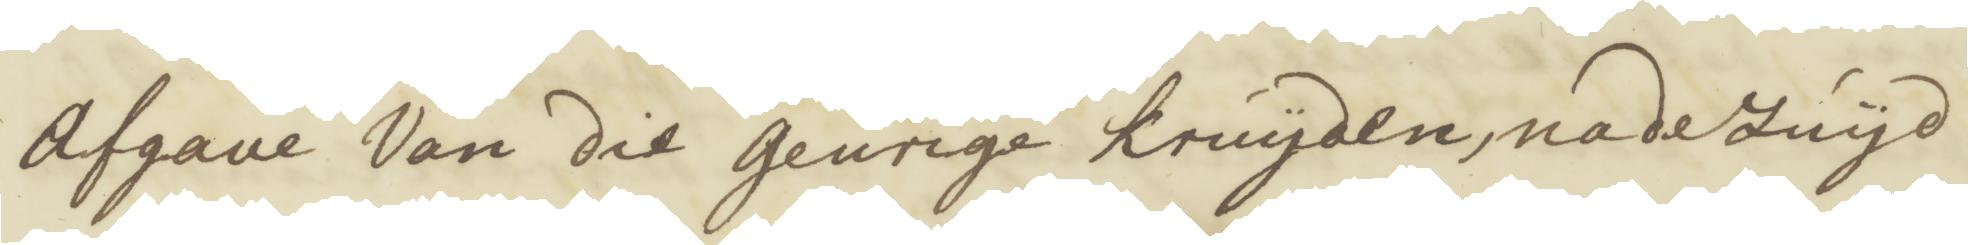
Afgave Van die Geurige kruijden, na de zuijd
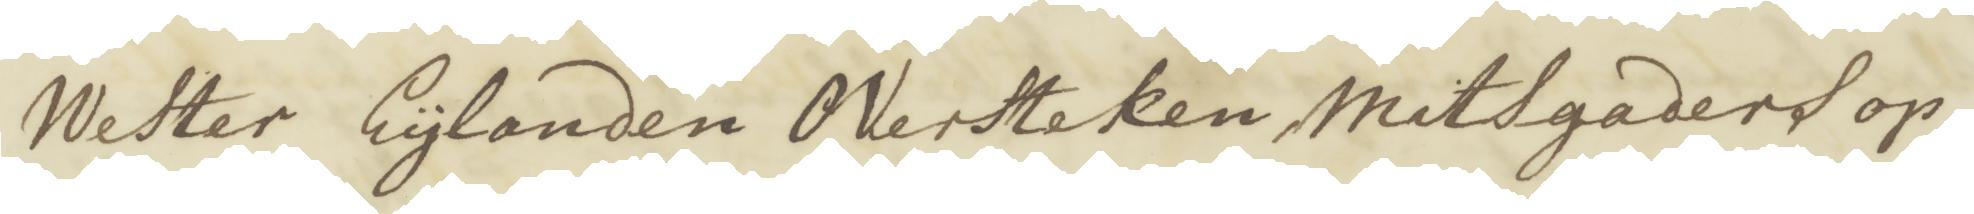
Wester Eijlanden OVersteken, mitsgaders op
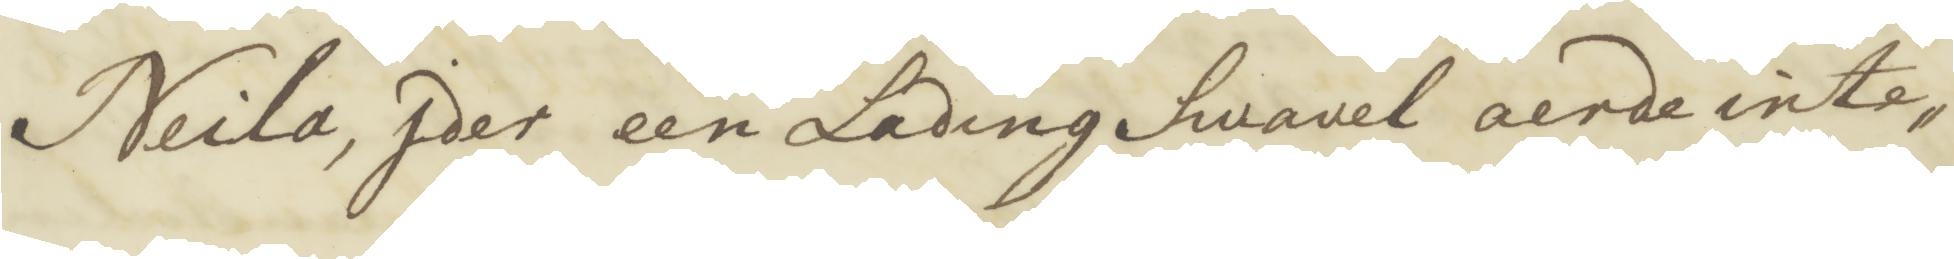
Neila, jder een Lading swavel aerde inte„
